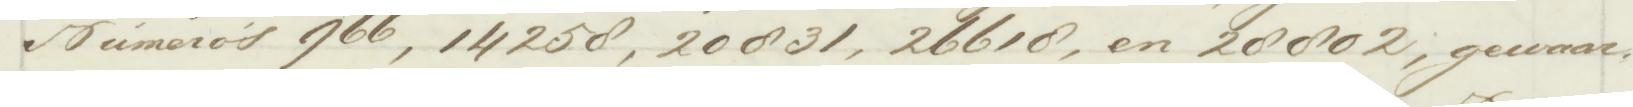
Numero's 966, 14258, 20831, 26618, en 28802, gewaar.
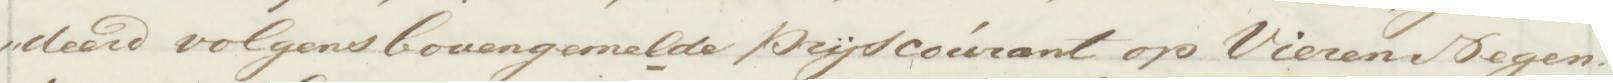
deerd volgens bovengemelde Prijscourant op Vieren Negen.
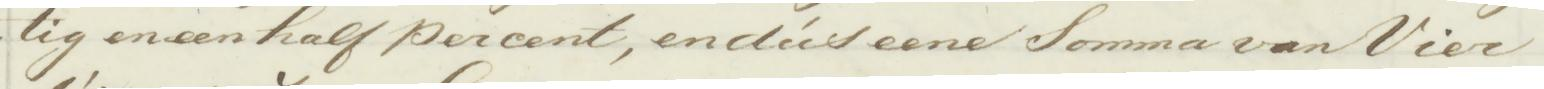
„ tig en een half percent, en dus eene somma van Vier
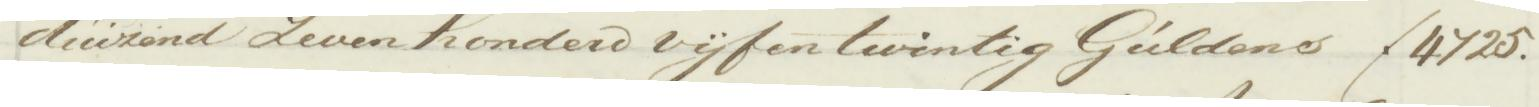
duizend Zeven honderd vijfen twintig Guldens ƒ 4725.
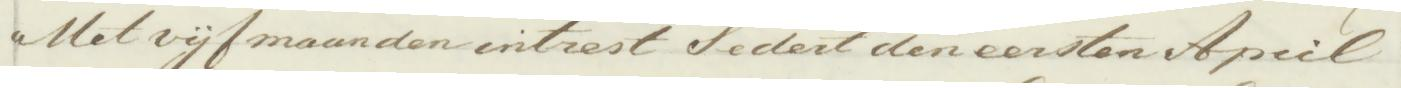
Met vijf maanden intrest sedert den eersten April
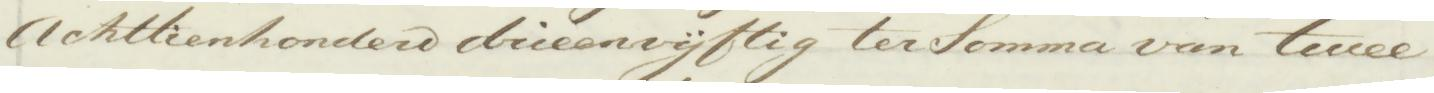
Achttienhonderd drieenvijftig ter Somma van twee
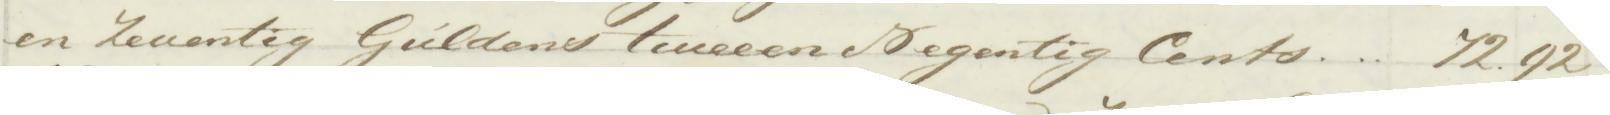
en Zeventig Guldens tweeen Negentig Cents . . . 72.92
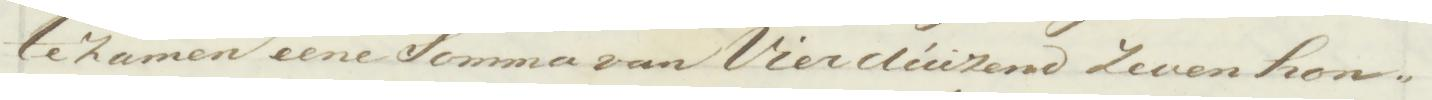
te zamen eene somma van Vier duizend zeven hon„
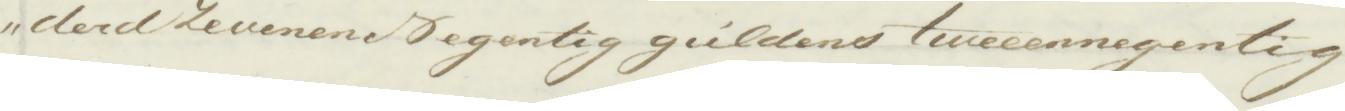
„derd zevenen Negentig guldens tweeennegentig
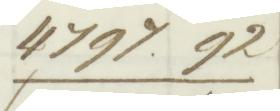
4797. 92
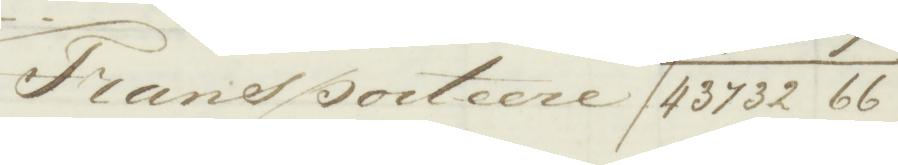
Transporteere ƒ43732 66
